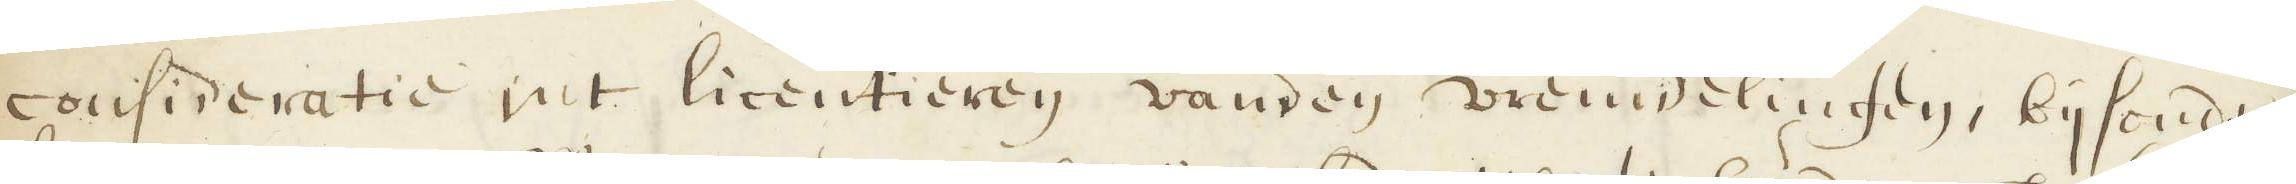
consideratie int licentieren vanden vremdelingen, bij sonder
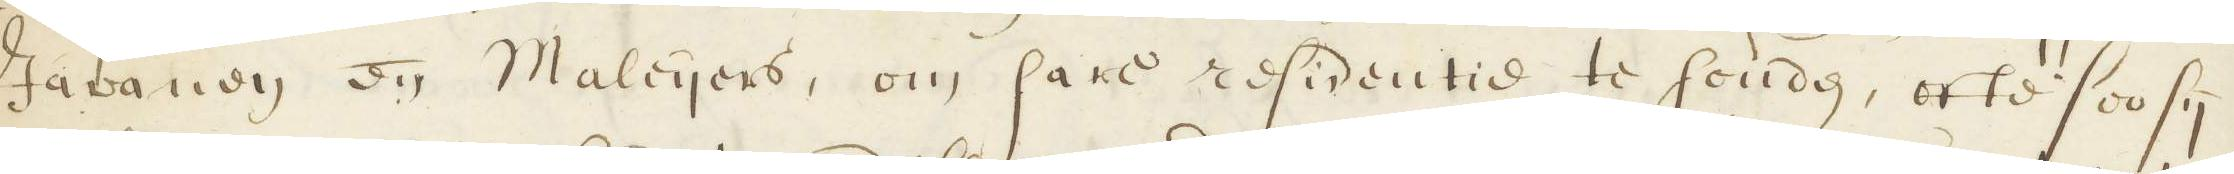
Javanen en Maleijers, om hare residentie te houden, ofte soo sij
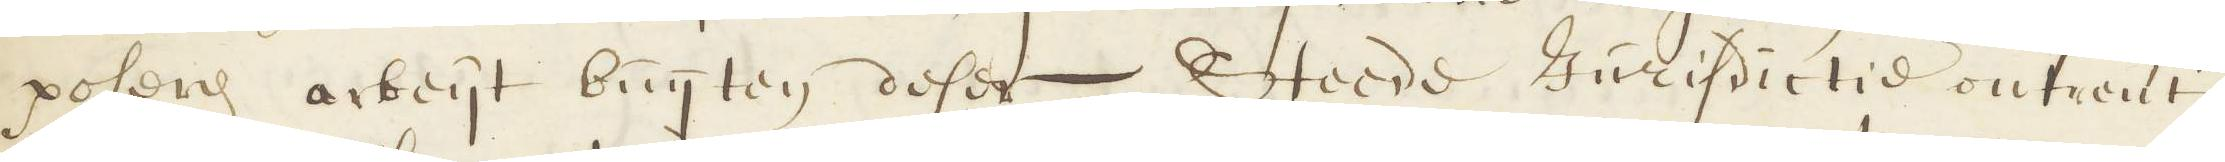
poseren arbeijt buijten deser Steede Iurisdictie ontrent
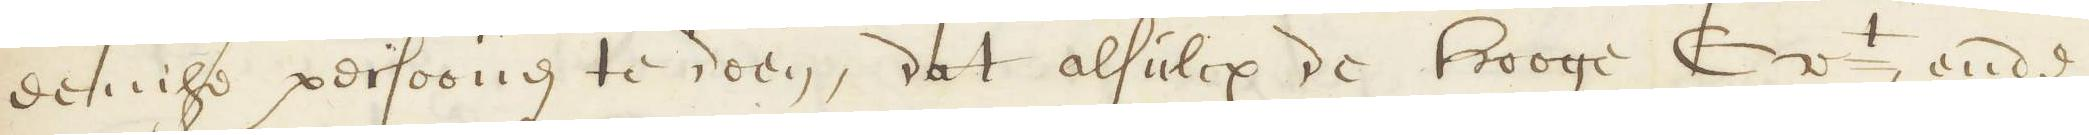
eenige persoonen te doen, dat alsulcx de hooge Ov=t, ende
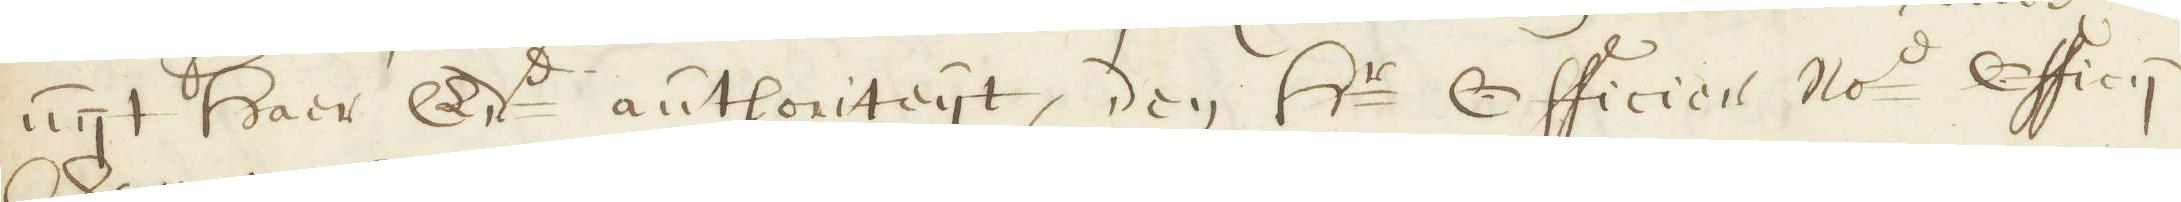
uijt haer Ed=e authoriteijt, den H=r Officier No=e Officij
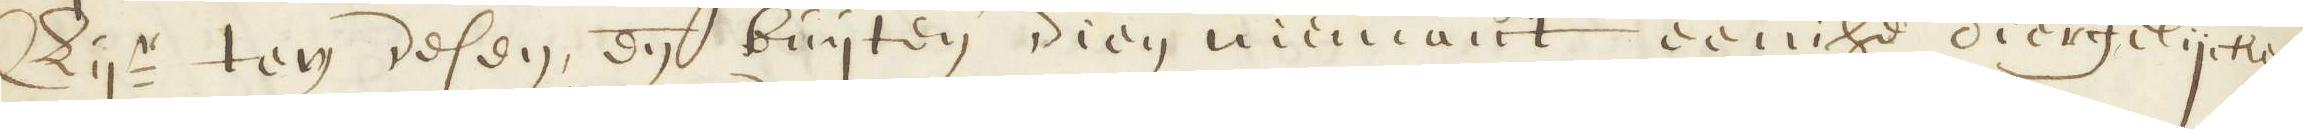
Eij=r ten desen, en buijten dien niemant eenige diergelijcke
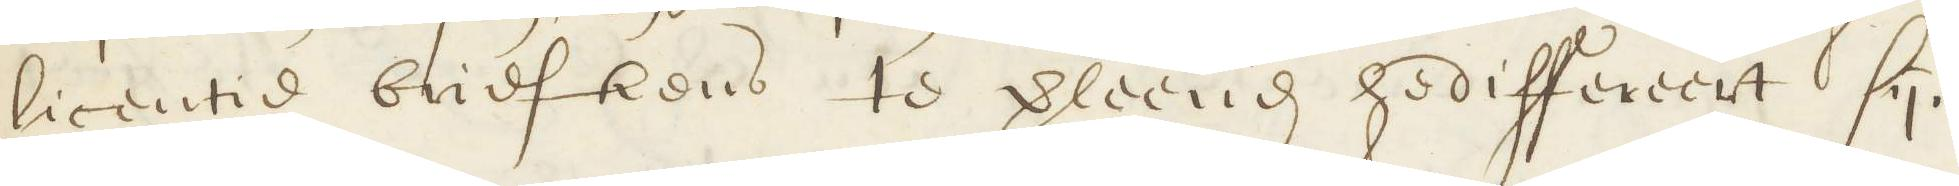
licentie briefkens te verleenen gediffereert sij.
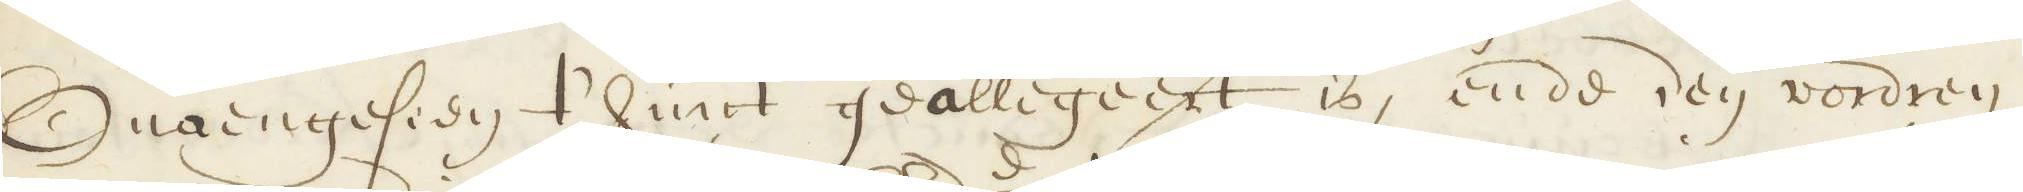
Onaengesien t'gunt geallegeert is, ende den vordren
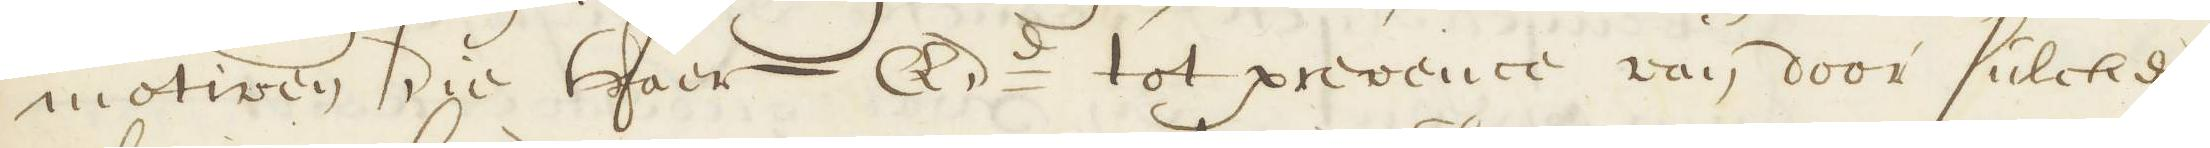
motiven die haer Ed=e tot prevence van door sulcke
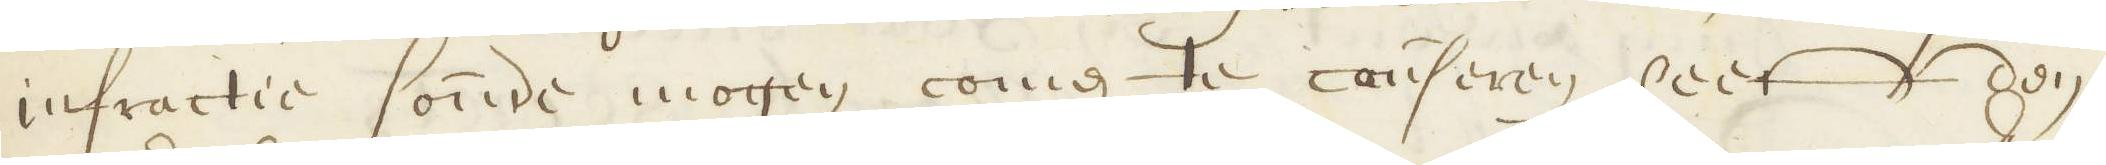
infractie soude mogen come te causeren heeft den
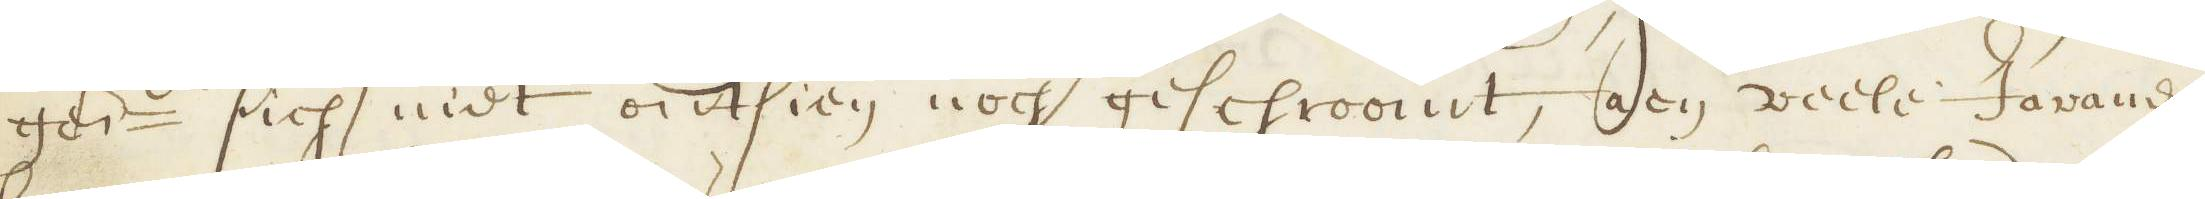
ged=e sich niet ontsien noch geschroomt, den veele Javanen
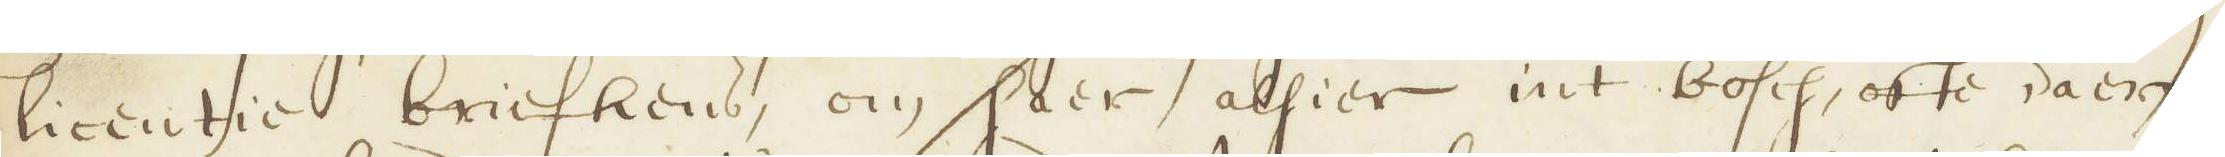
licentie briefkens, om haer alhier int bosch, ofte daer
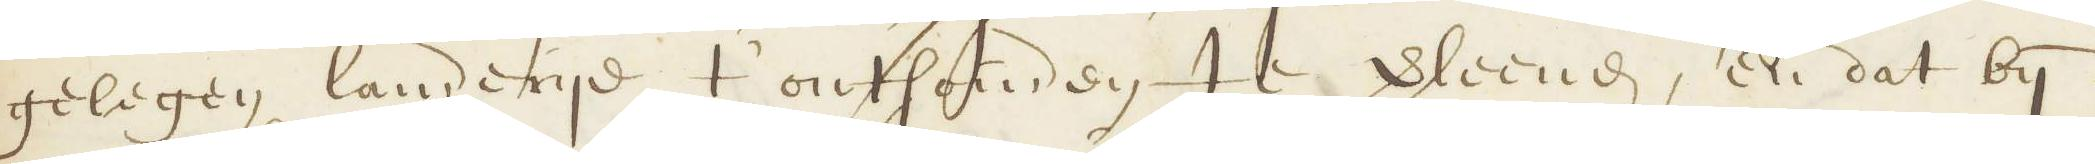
gelegen landerije t' onthouden te verleenen, en dat bij
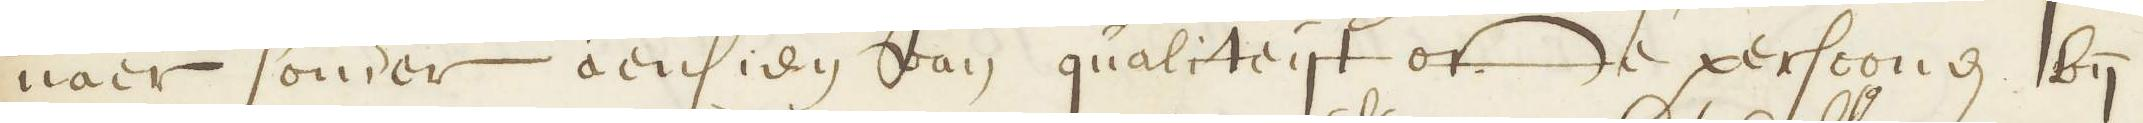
naer sonder aensien van qualiteijt ofte persoonen bij
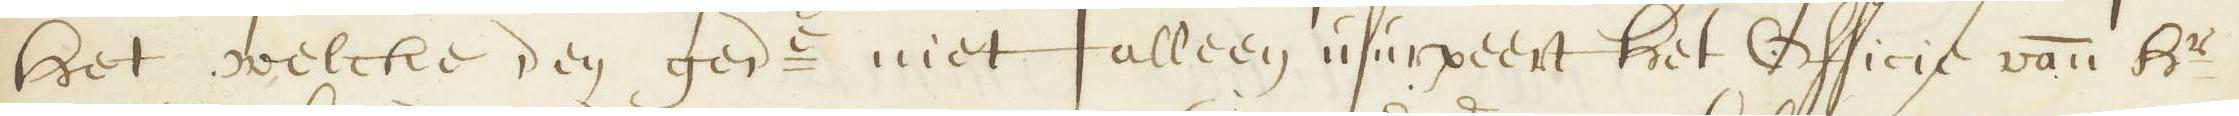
het welcke den ged=e niet alleen usurpeert het Officie van H=r
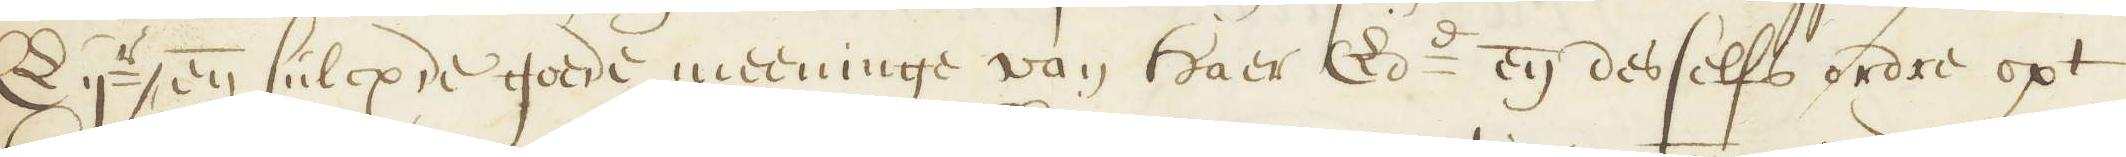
Eij=r, en sulcx de goede meeninge van haer Ed=e en desselfs ordre opt
